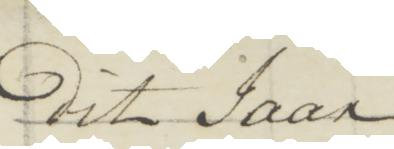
dit Iaar
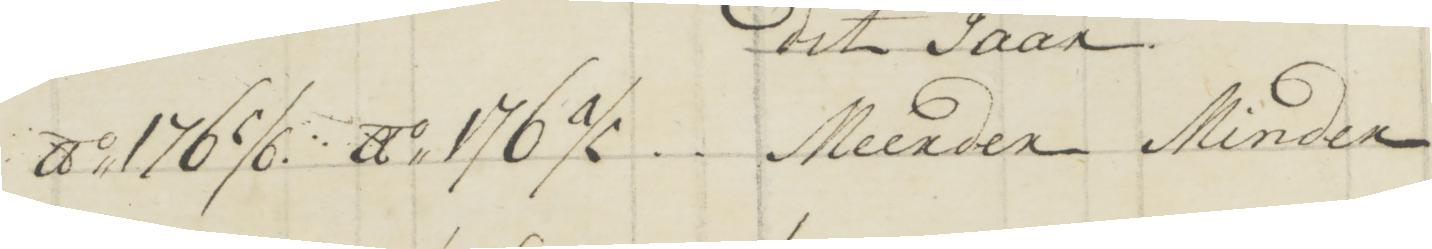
A„o 176 5/6 A„o 176 4/5 . . Meerder Minder
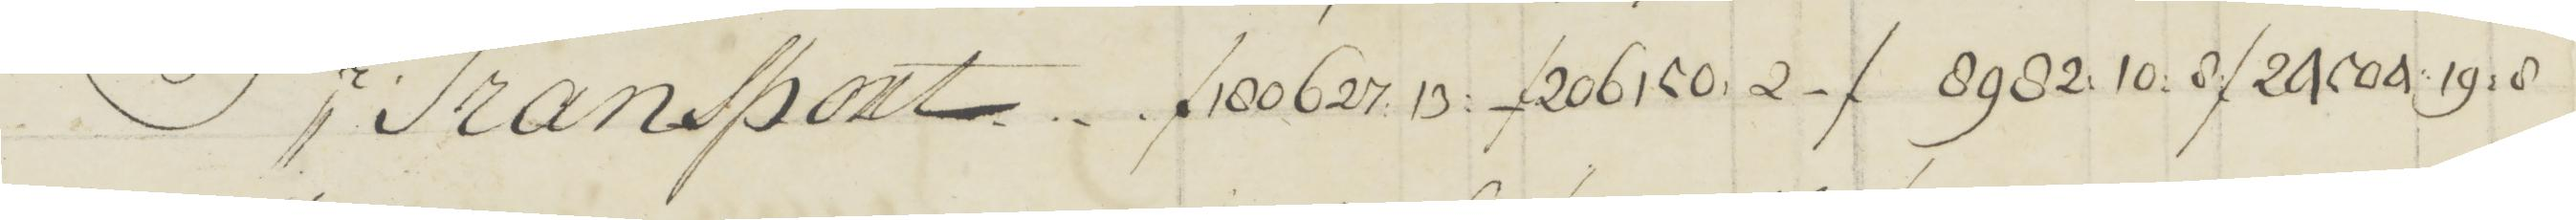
P„r Transport - .- .ƒ180627:13: ƒ206150:2— ƒ 8982:10:8: ƒ 24504:19:8
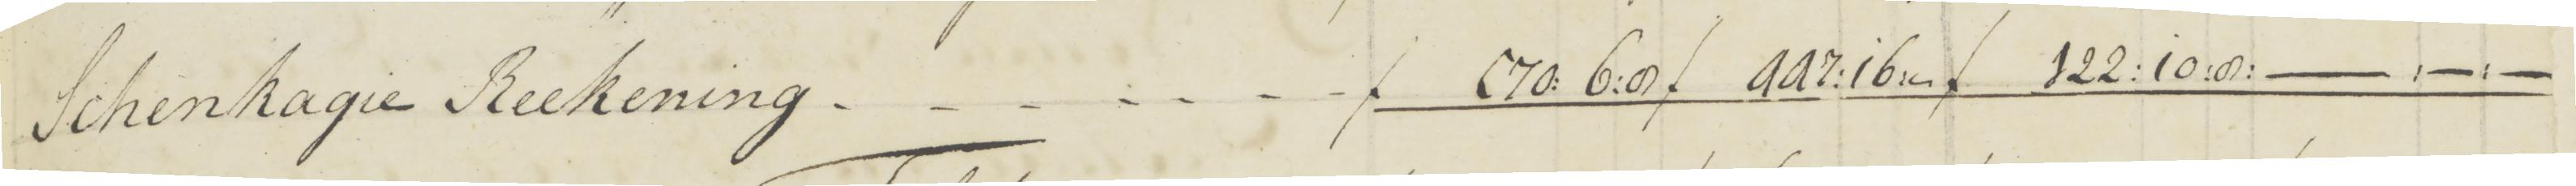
Schenkagie Reekening - - - - - - - ƒ 570:6:8 ƒ 447:16:~ ƒ 122:10:8: —:—:—
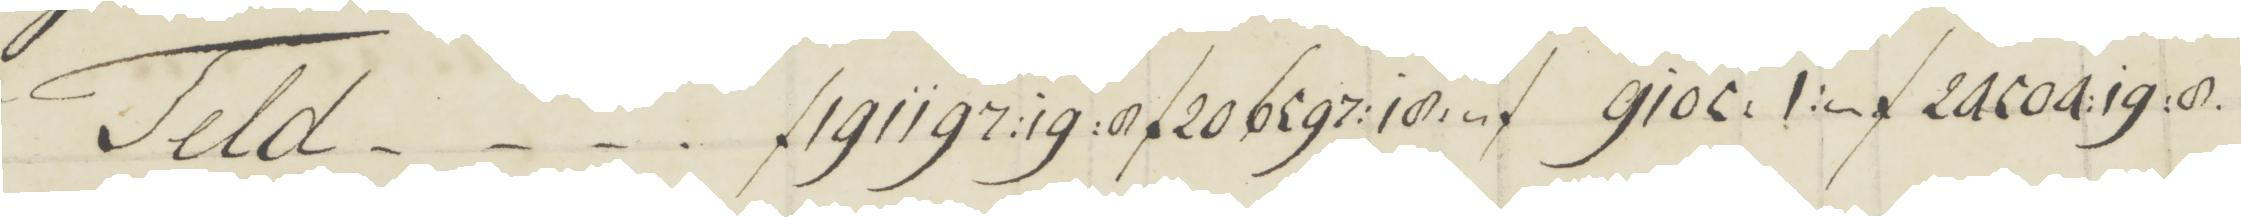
Teld - - - . ƒ191197:19:8 ƒ206597:18:~ ƒ 9105:1:~ ƒ 24504:19:8.
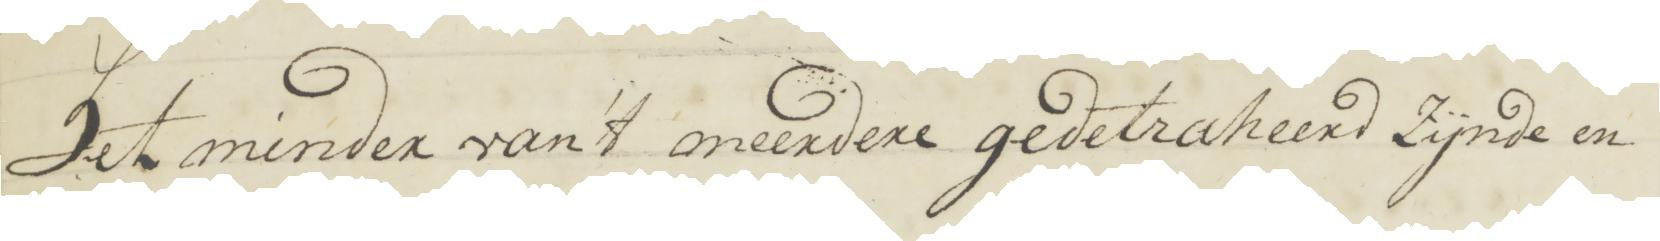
Het minder van ’t meerdere gedetraheerd zijnde en
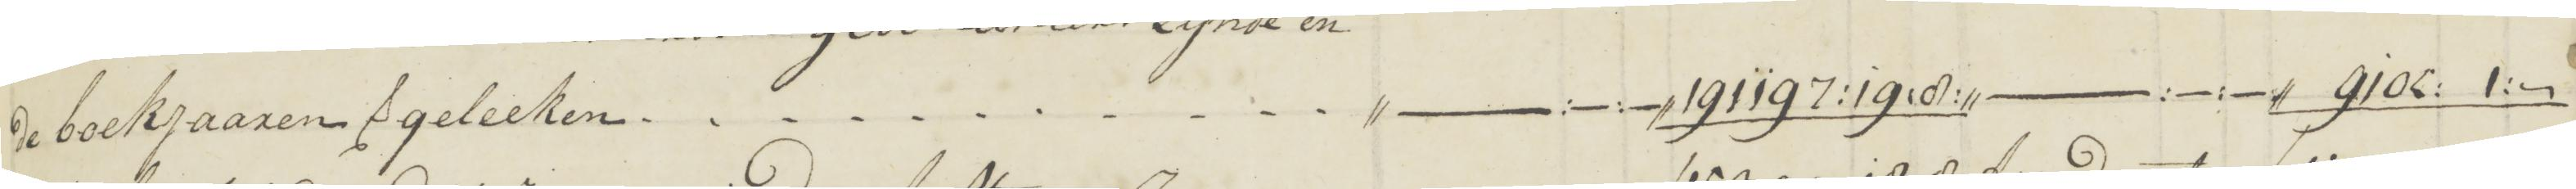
de boekjaaren vergeleeken - - - - - - . - - - -„ —:—:—„191197:19:8:„ —: —: —„ 9105:1:~
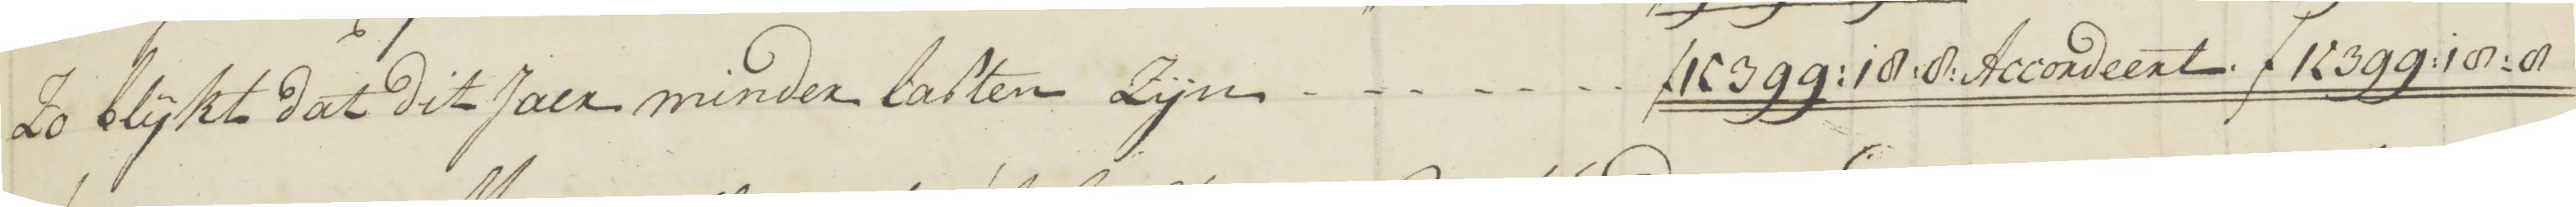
zo blijkt dat dit Jaer minder lasten zijn - - - - - - - ƒ15399:18:8: Accordeert. ƒ 12399:18:8
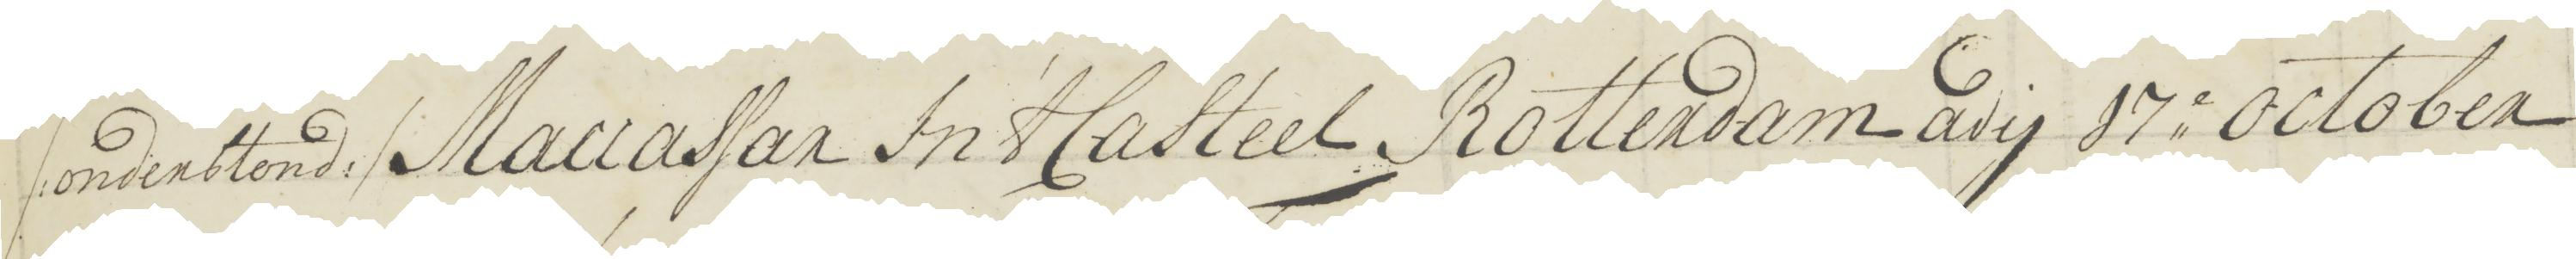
/:onderstond:/ Maccassar In ’t Casteel, Rotterdam adij 17„e october
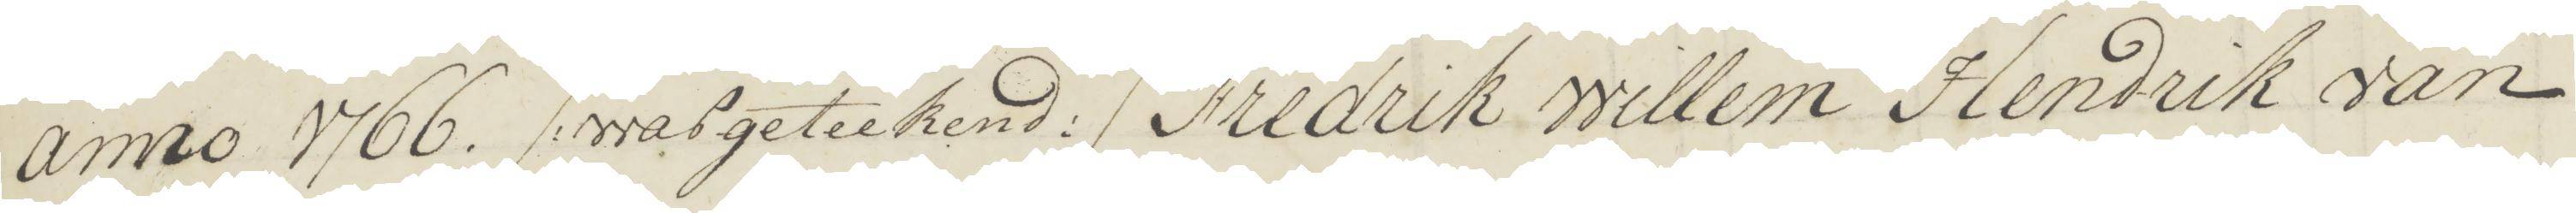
anno 1766. /:was geteekend:/ Fredrik Willem Hendrik van
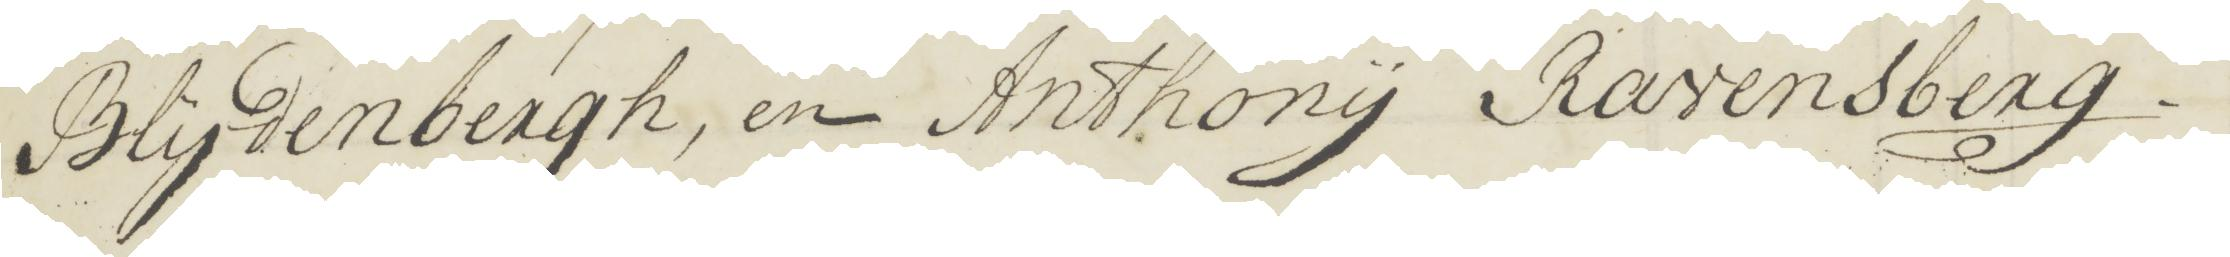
Blijdenbergh, en Anthonij Ravensberg-
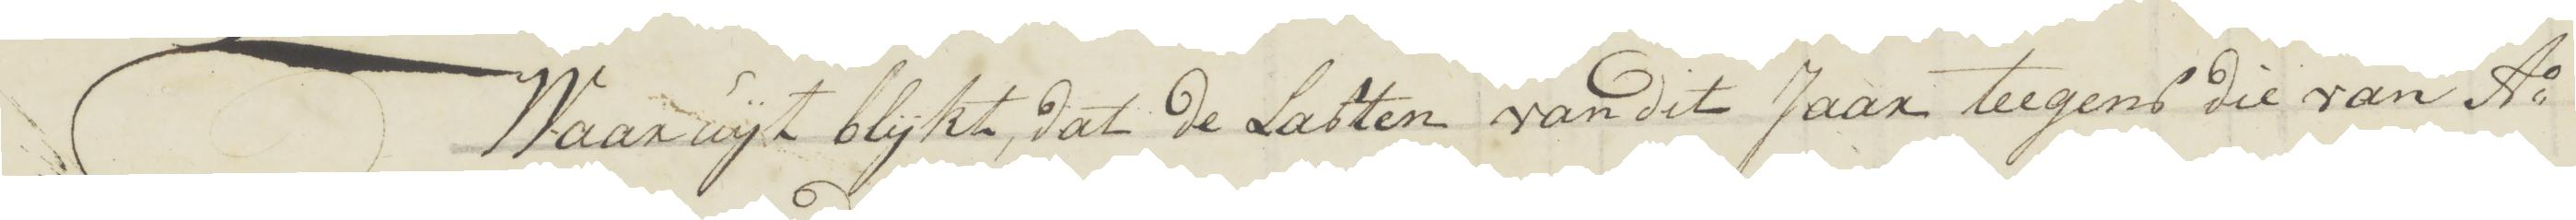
Waar uijt blijkt, dat de lasten van dit Jaar teegens die van A„o
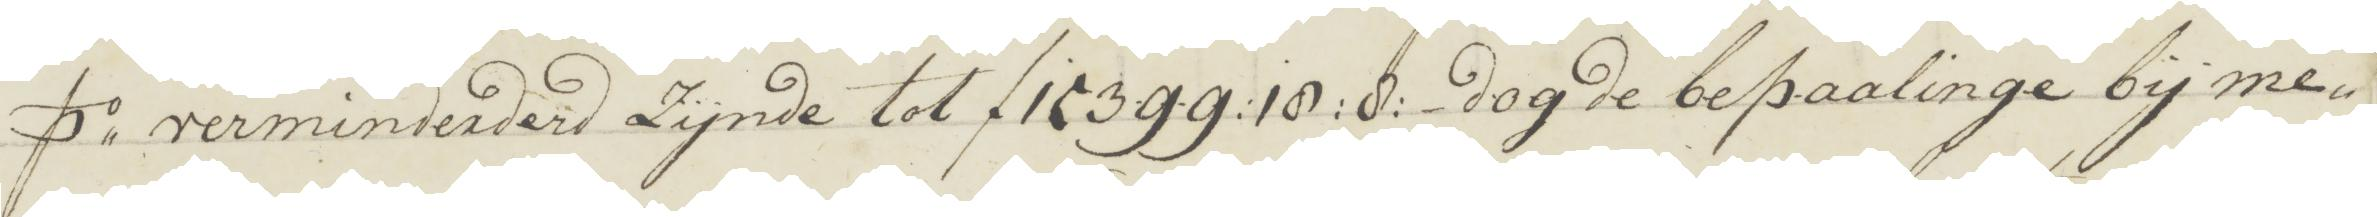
p„o verminderderd zijnde tot ƒ15399:18:8:—dog de bepaalinge bij me„
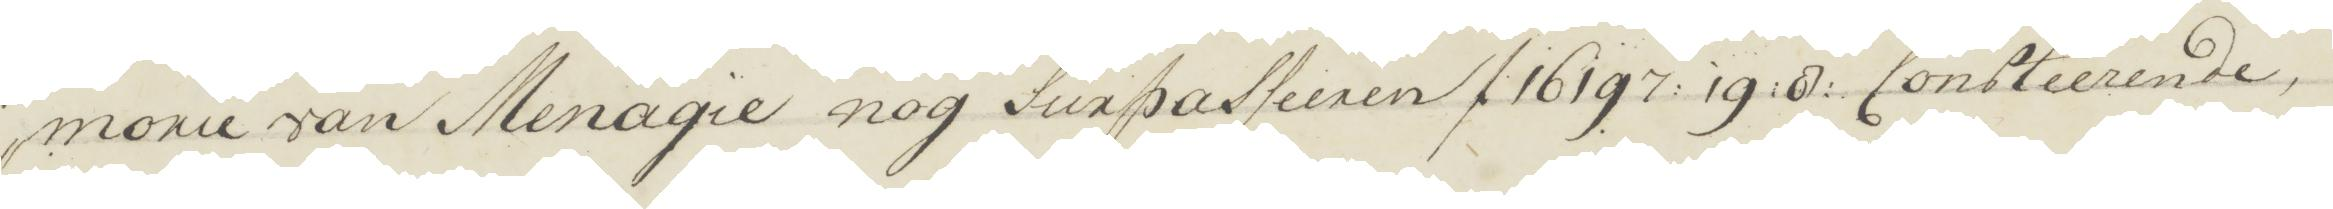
„morie van Menagie nog surpasseeren ƒ16197:19:8: Consteerende,
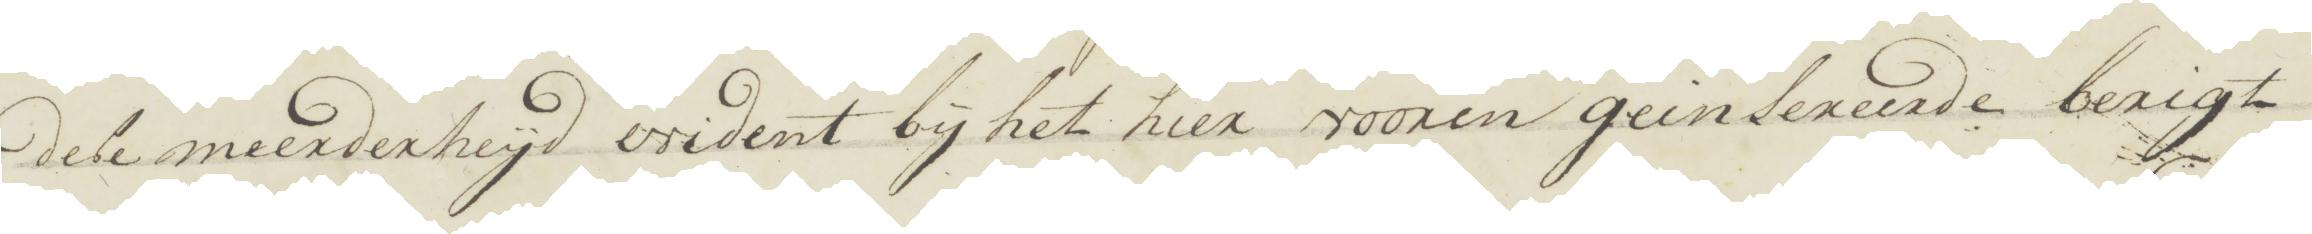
dese meerderheijd evident bij het hier vooren geinsereerde berigt
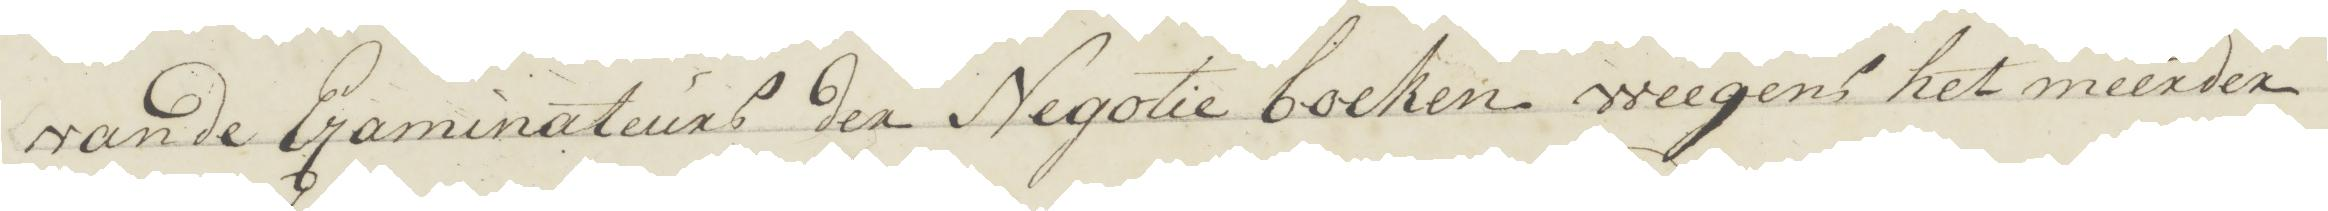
van de Examinateurs der Negotie boeken weegens het meerder
